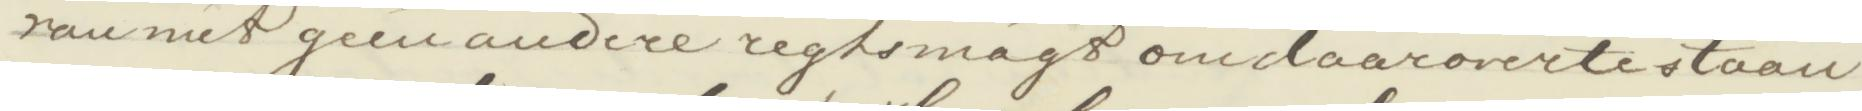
van met geen andere regtsmagt om daarover te staan
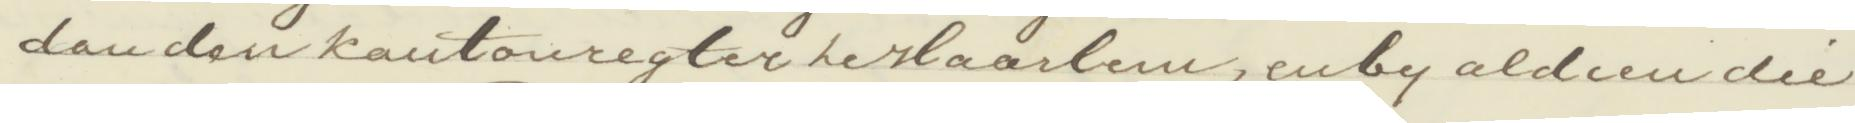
dan den kantonregter teHaarlem, en by aldien die
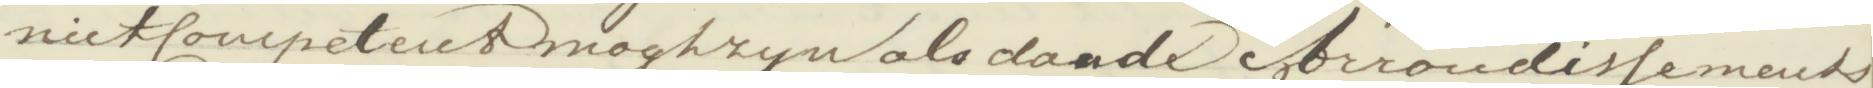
niet Competent mogt zyn als dande Arrondissements
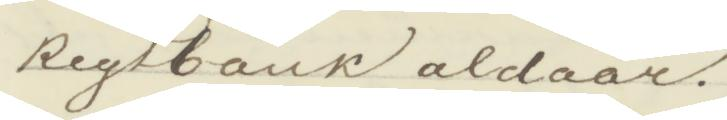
Regtbank aldaar.
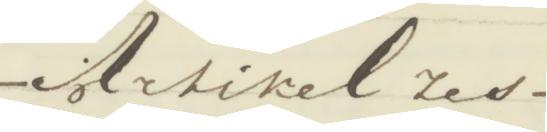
Artikel zes.
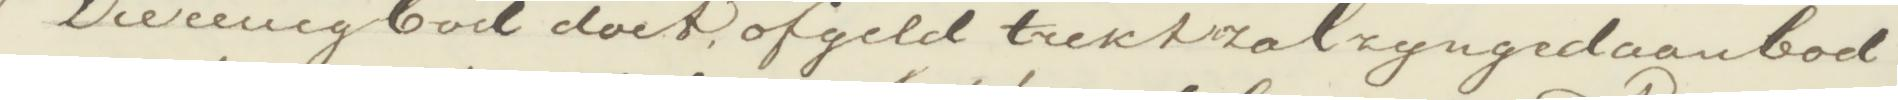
Die eenig bod doet, of geld trekt zal zyn gedaan bod
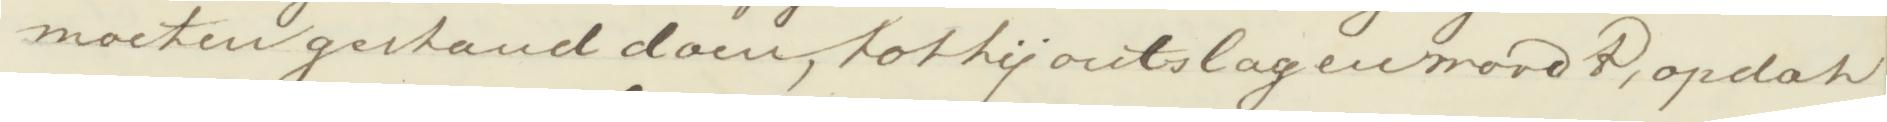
moeten gestand doen, tot hij ontslagen wordt, opdat
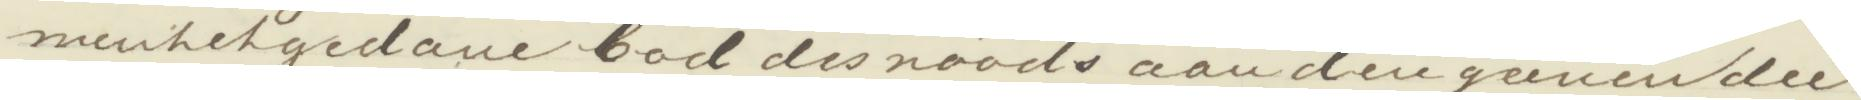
men het gedane bod des noods aan den geenen die
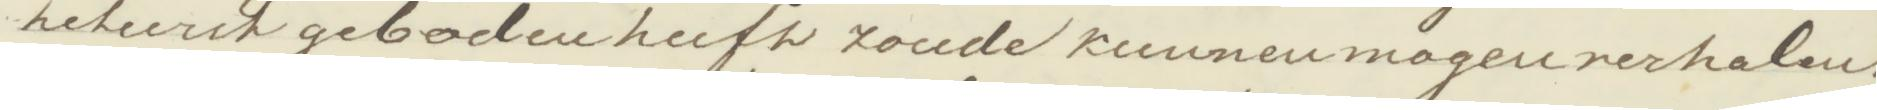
het eerst geboden heeft zoude kunnen mogen verhalen
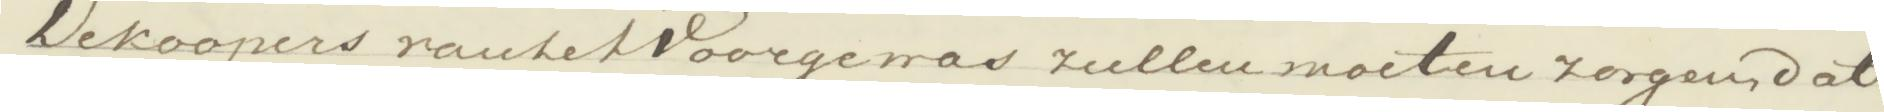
De koopers van het Voorgewas zullen moeten zorgen dat
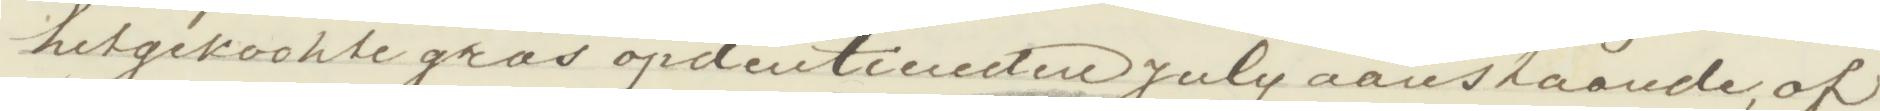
het gekochte gras op dentienden july aanstaande, of
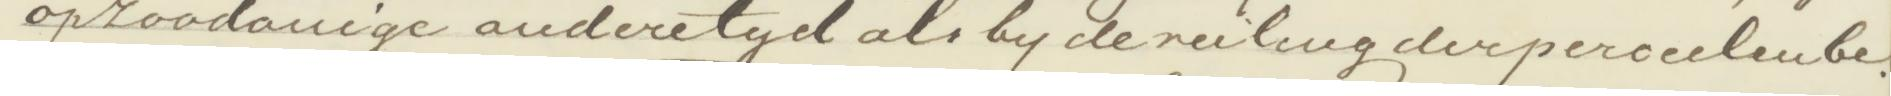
op zoodanige andere tyd als by de veiling der perceelen be
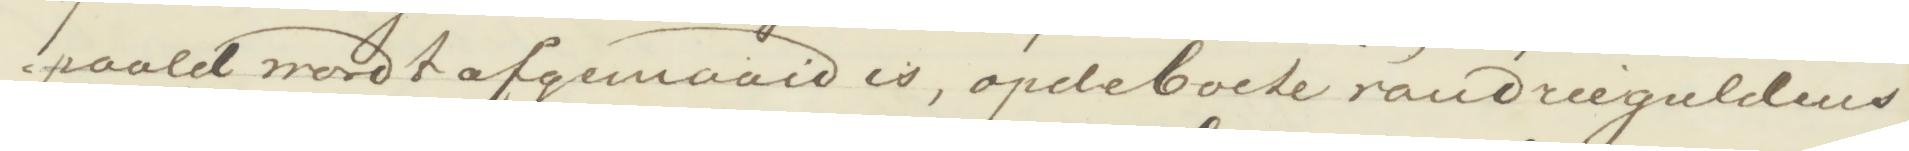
paald wordt afgemaaid is, op de boete vandrie guldens
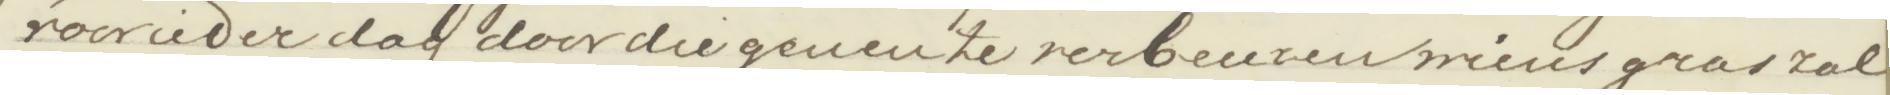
voor ieder dag door die genen te verbeuren wiens gras zal
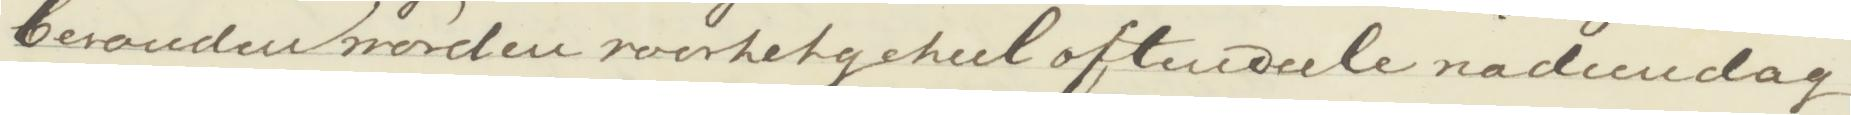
bevonden worden voor het geheel of tendeele na dien dag
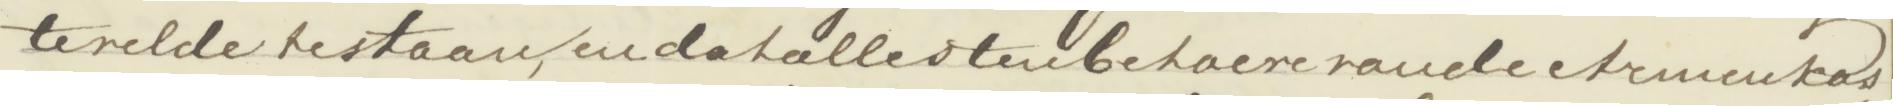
te velde te staan, en datalles ten behoeve vande Armenkas
